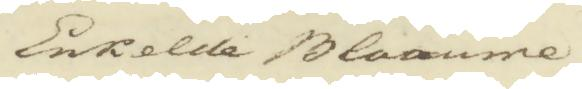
Enkelde Blaauwe
